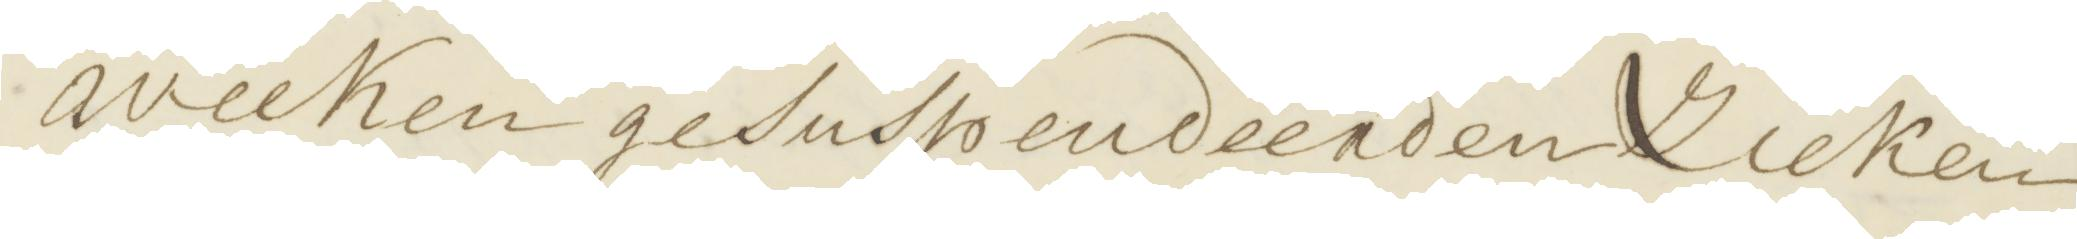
weeken gesuspendeerden Zieken
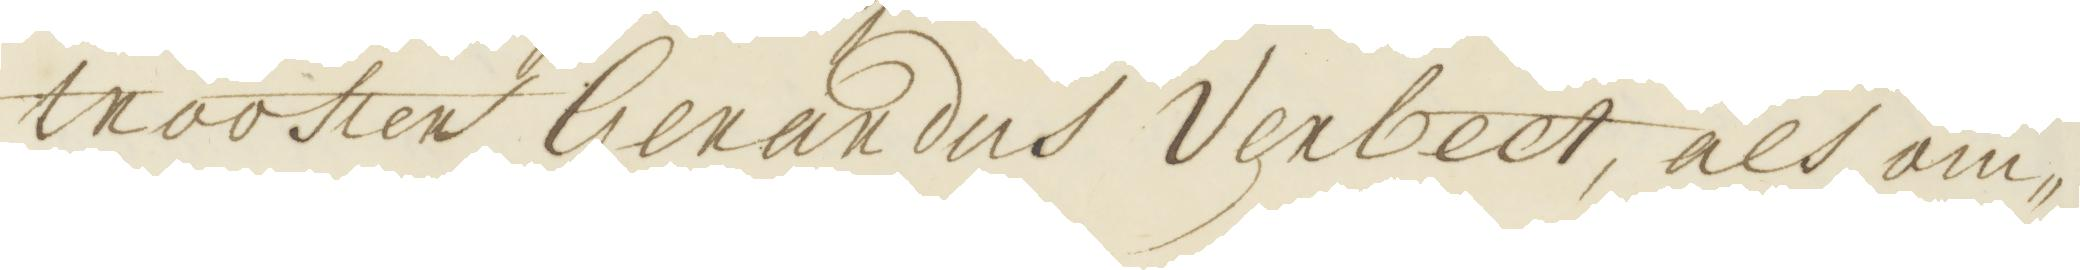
trooster Gerardus Verbeet, als om„
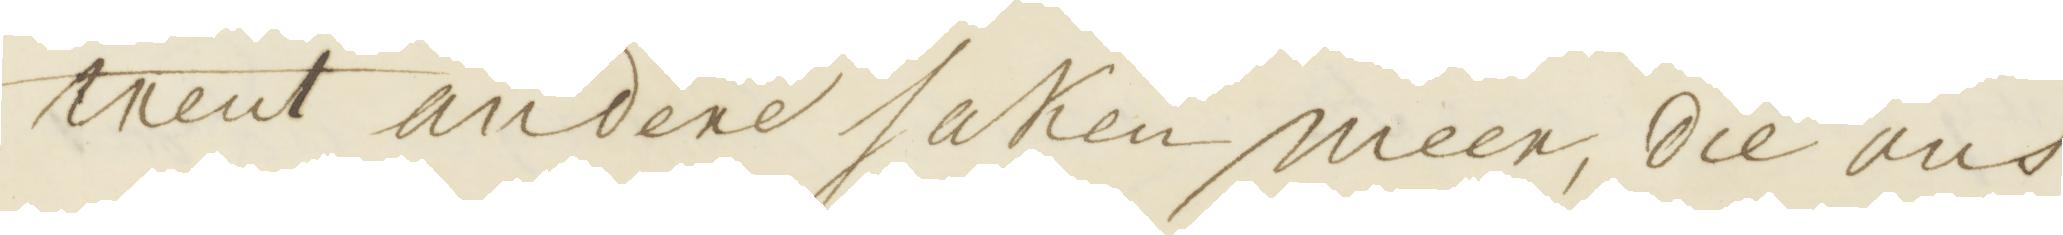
trent andere Saken meer, die ons
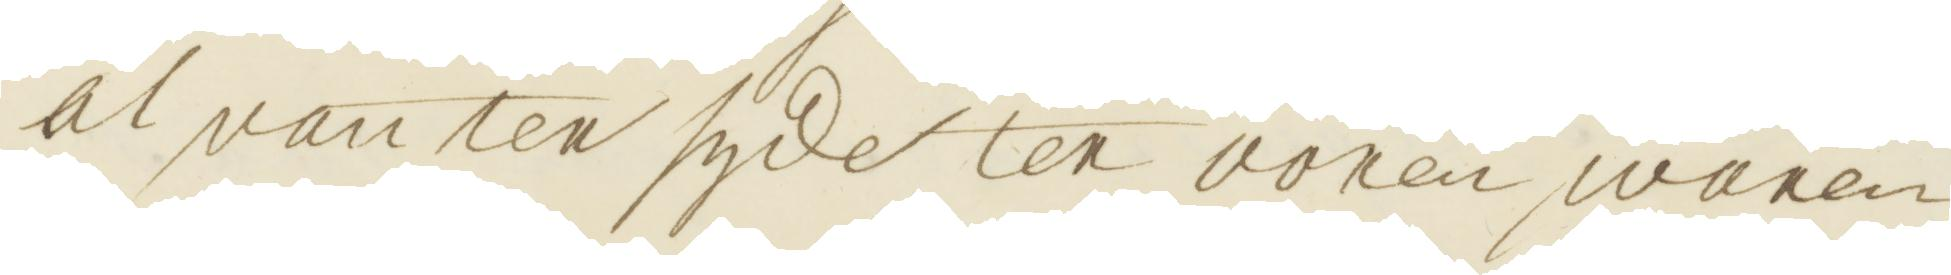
al van ter syde ter voren waren
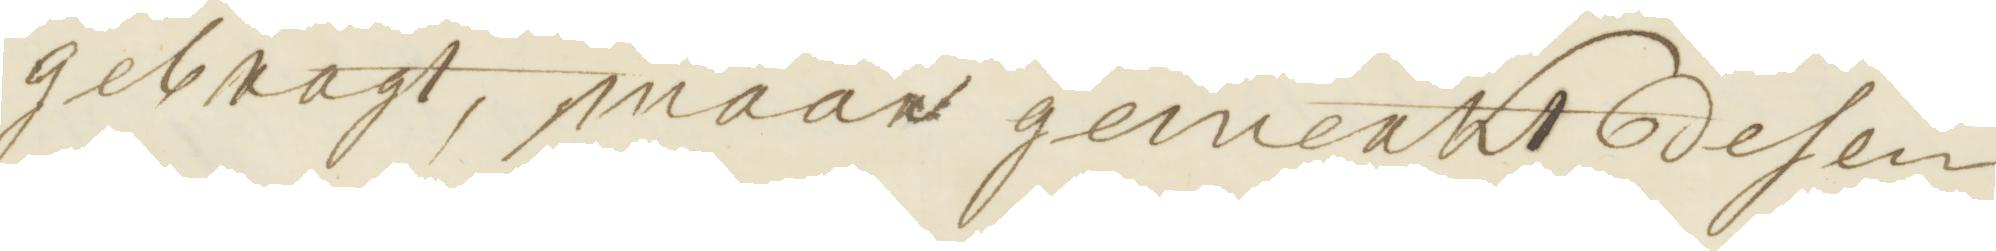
gebragt, maar gemerkt desen
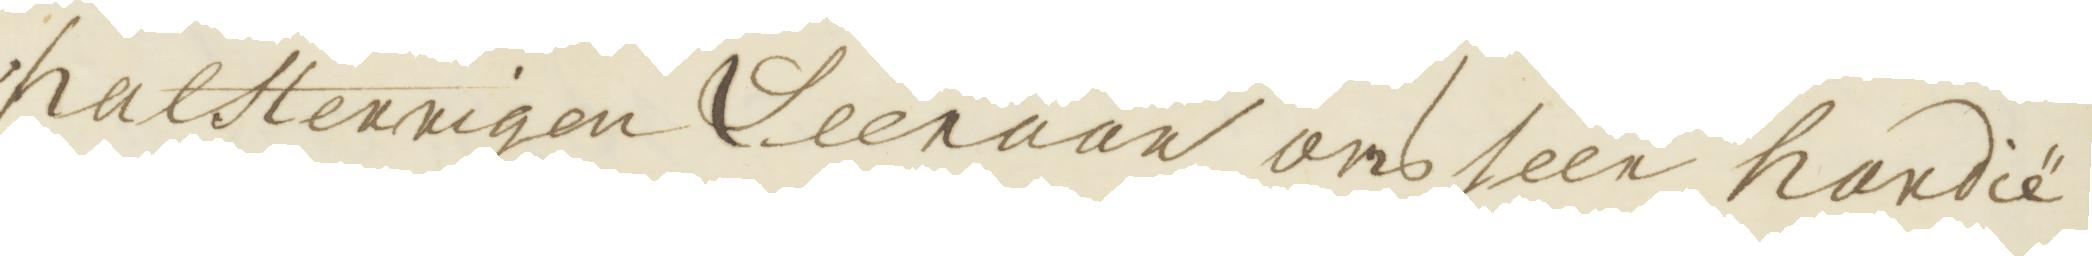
halsterrigen Leeraar ons seer hardié
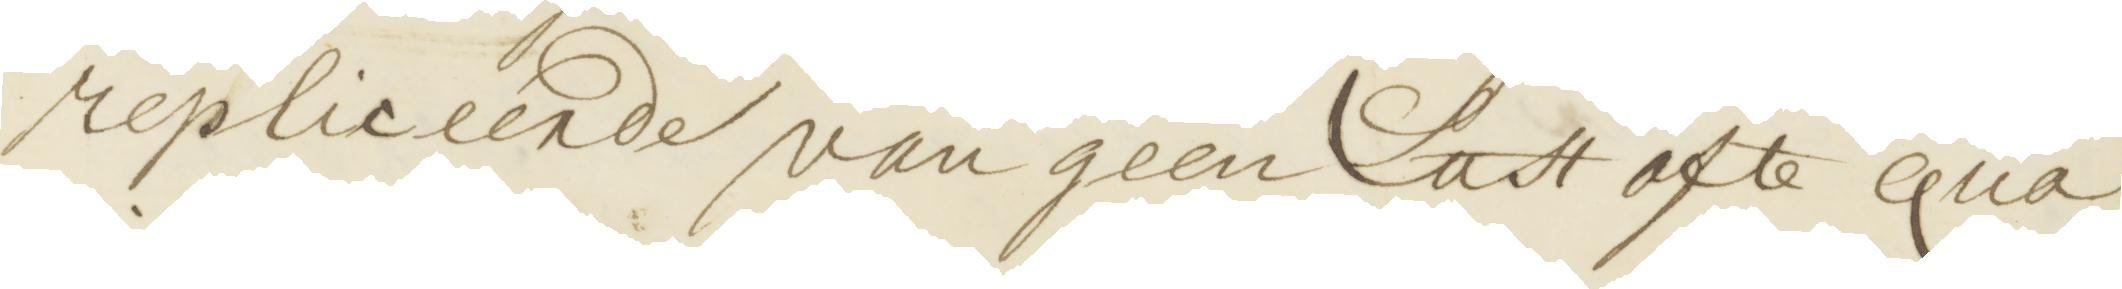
repliceerde van geen Last ofte qua
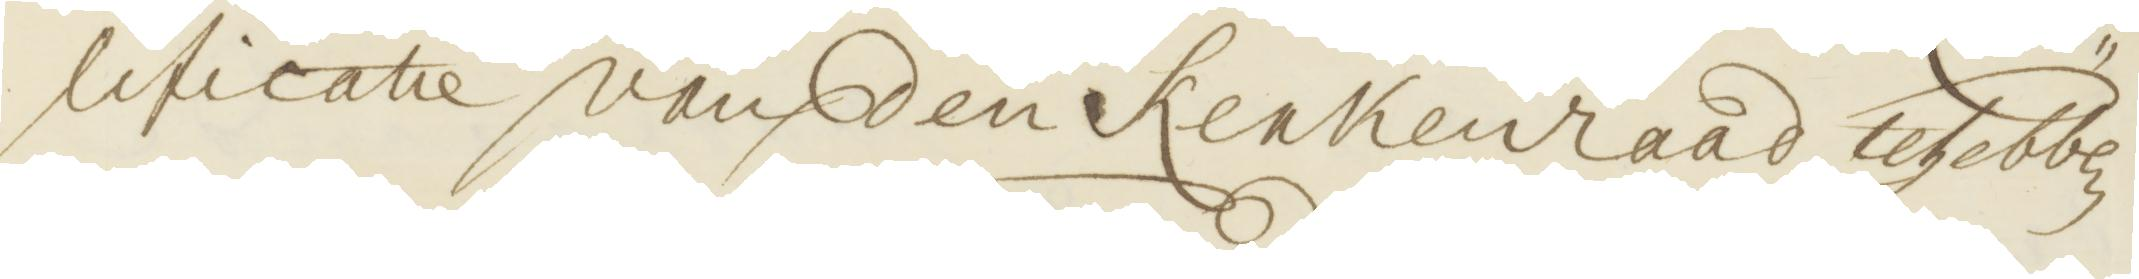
lificatie van den kerkenraad te hebben
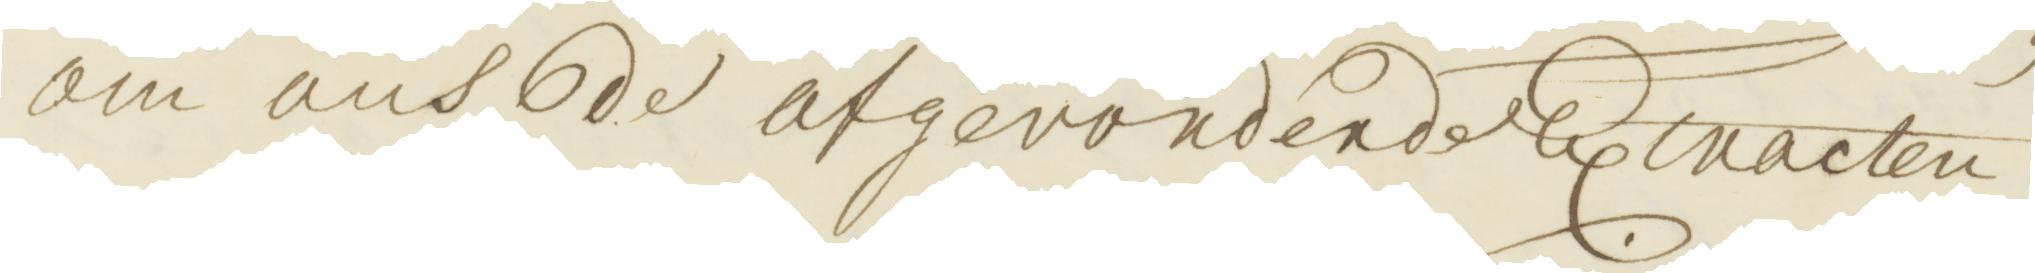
om ons de afgevorderde Extracten
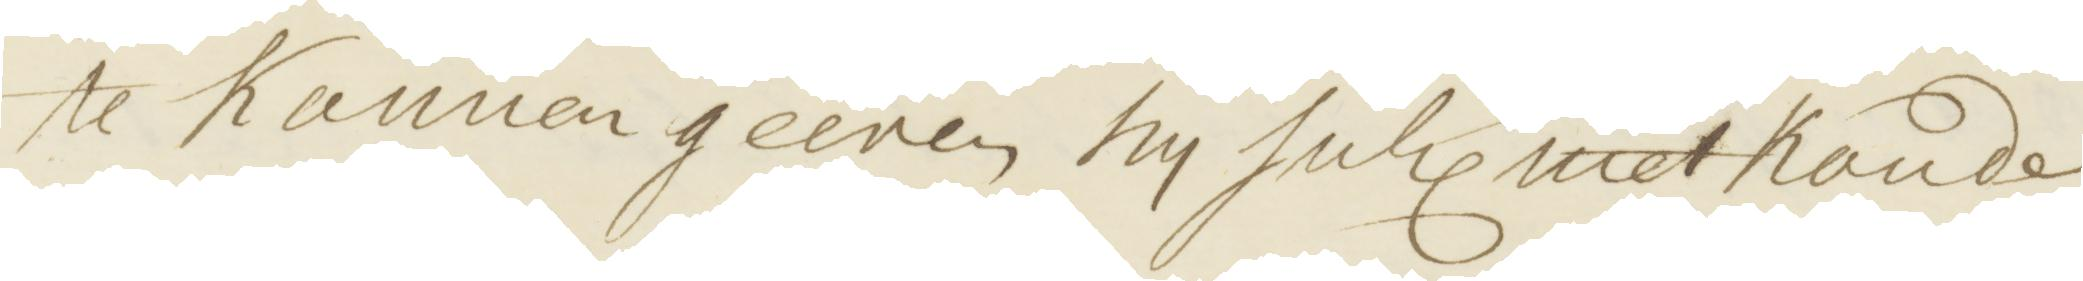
te kunnen geeven hy sulx niet konde
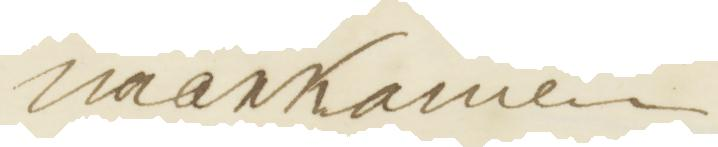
naar Kamen
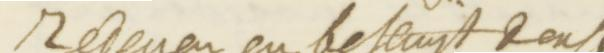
redenen en besluijt ter
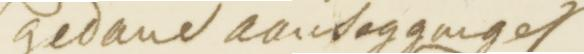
gedane aansegginge
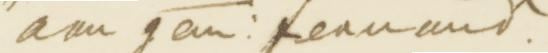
aan gem: fernand.
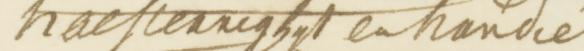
halstarrighyt en hardié
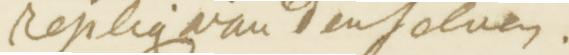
repliq van denselven.
